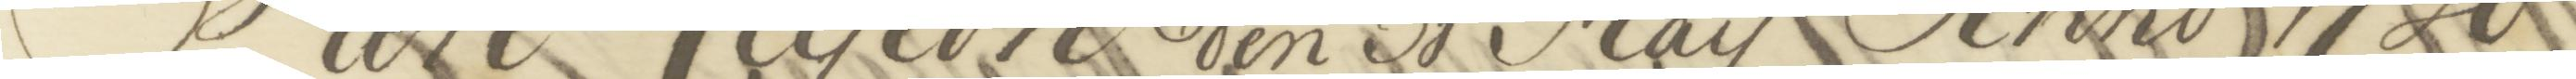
Van Ceijlon den 31 Maij Anno 1730
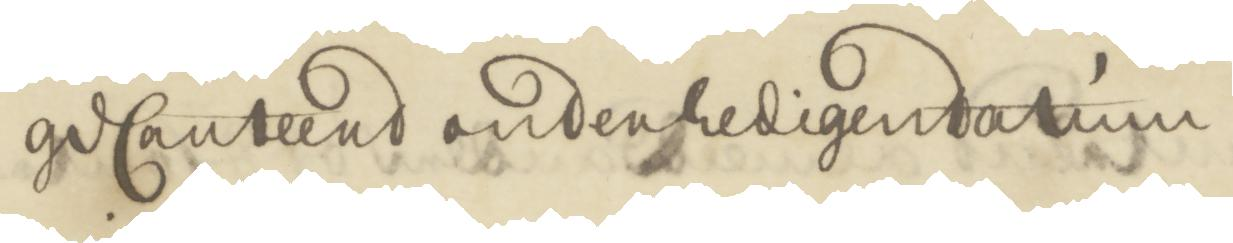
gecarteerd onder hedigen datum
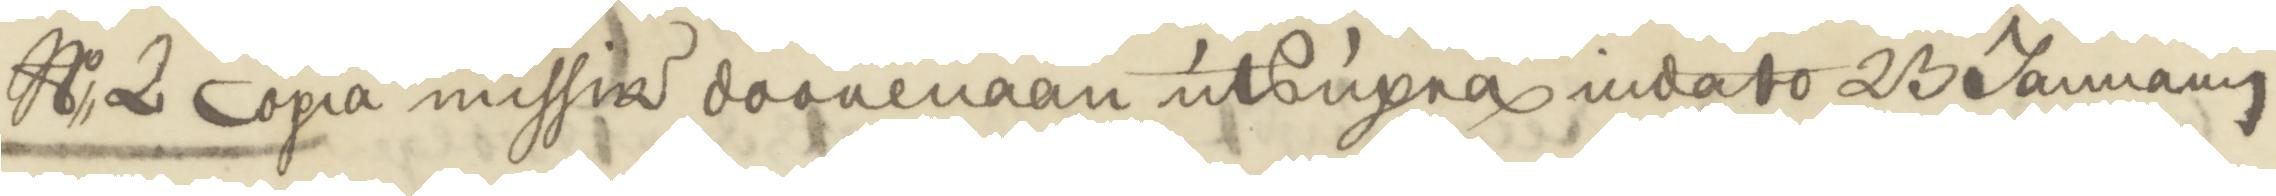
N„o 2 Copia missive doorenaan utsupra indato 23 Ianuary
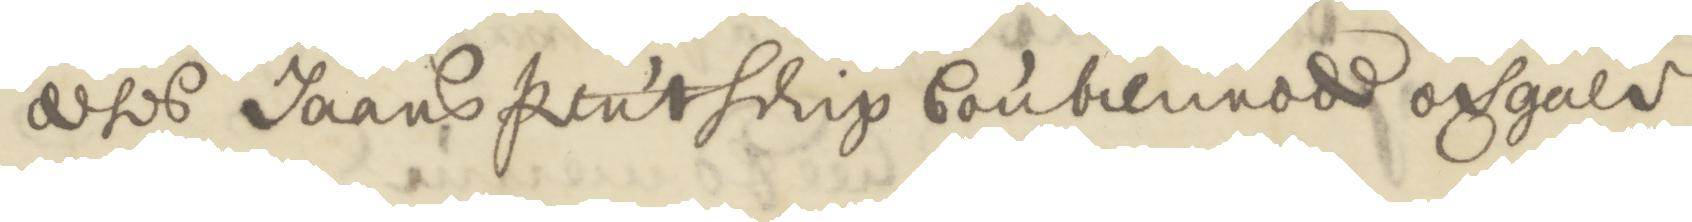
deses Iaars per't schip boukenrode over gale
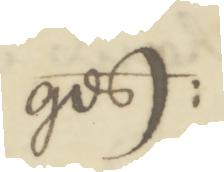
ges:
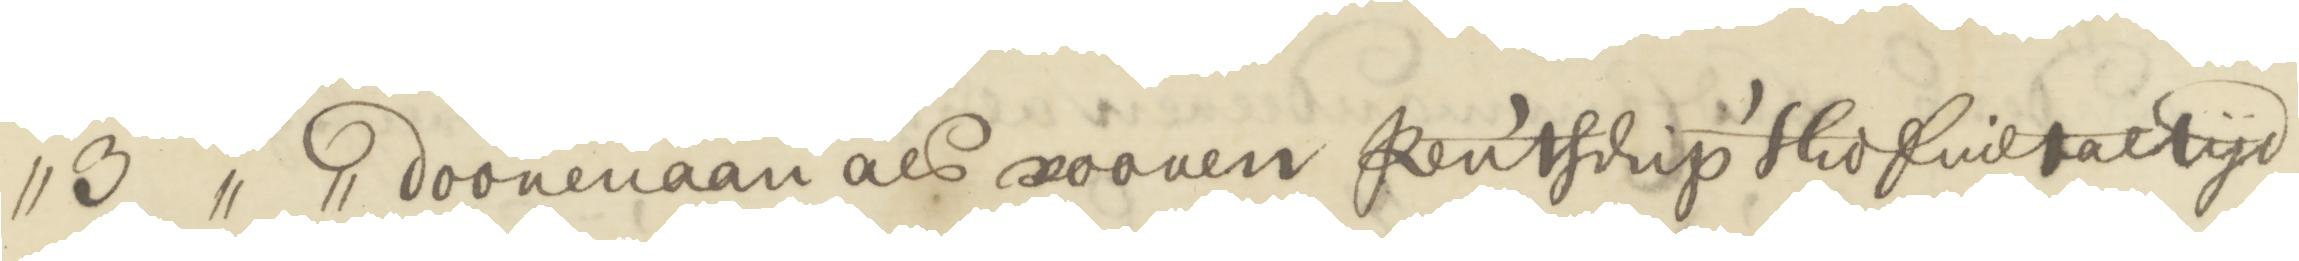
„3 „ „ doorenaan als vooren per'tschip 'thofnietaltijd
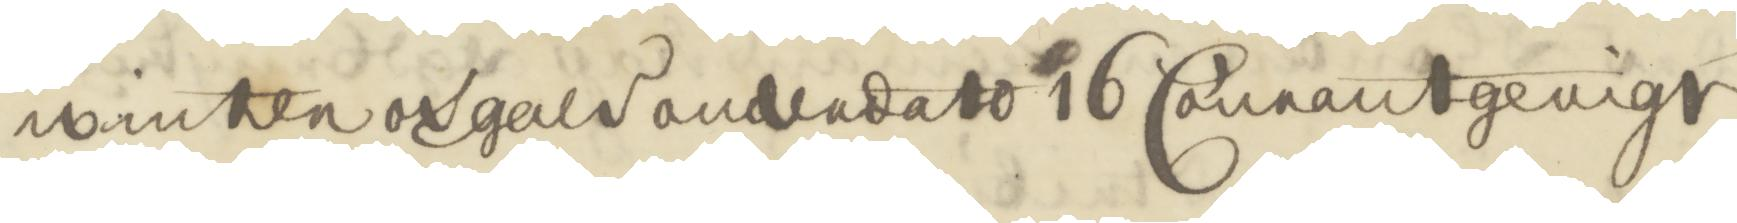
winter over gale onder dato 16 Courant gerigt
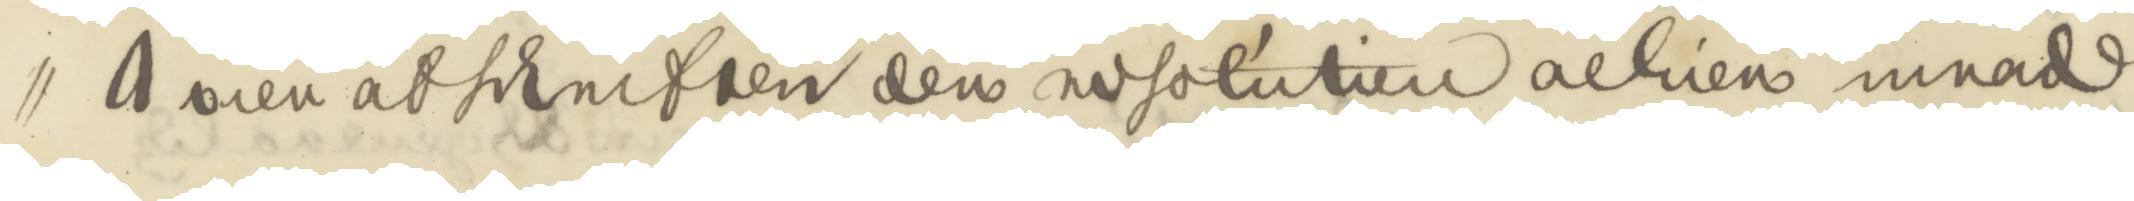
„ 4 vier afschriften der resolutien alhier inrade
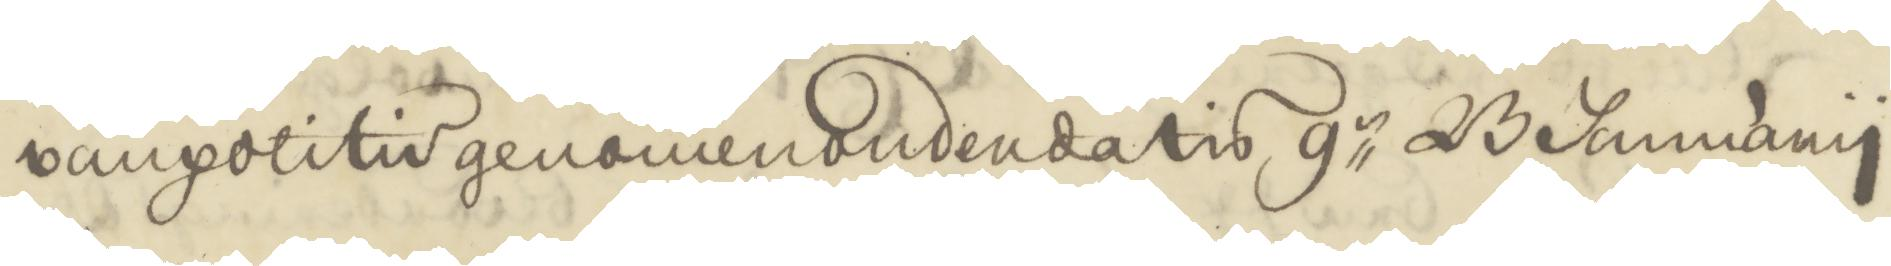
van politie genomen onder datis g„e 23 Ianuarij
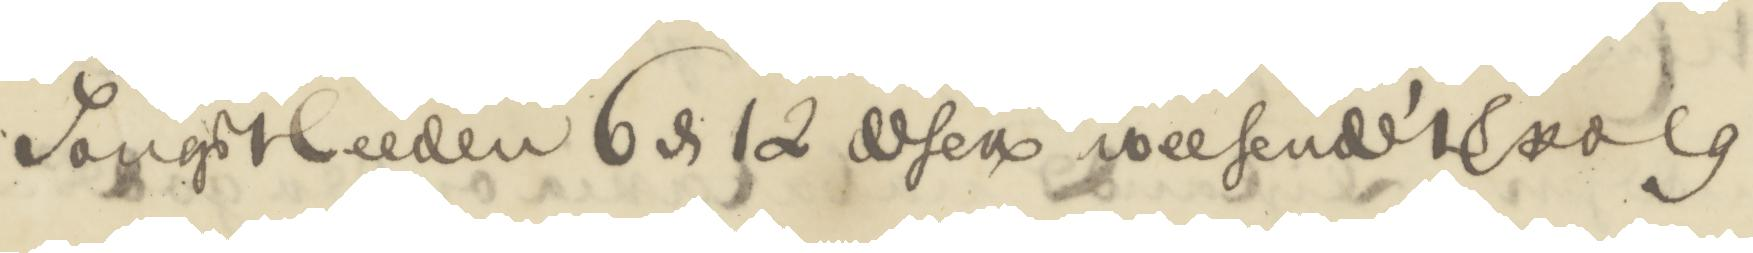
Iongstleeden 6 en 12 deser weesende 't vervolg
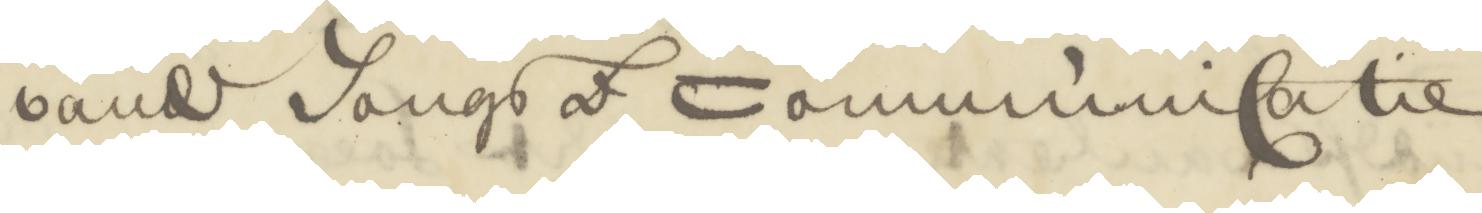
vande Iongste Communicatie
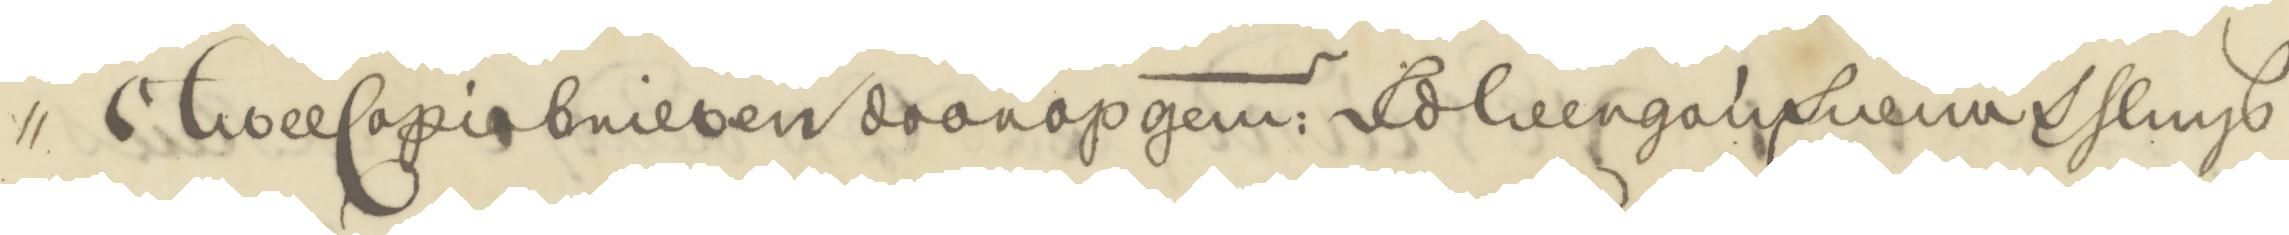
„ 5 twee Copia brieven door op geme: Ed heer gouverneur Versluys
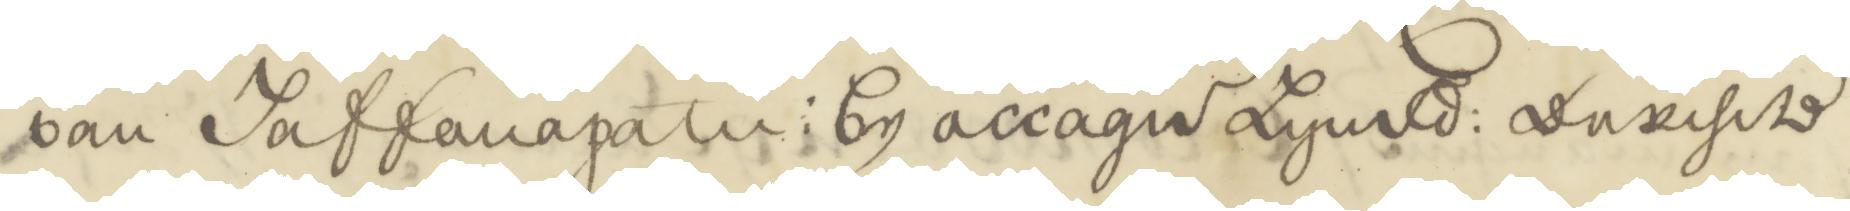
van Iaffanapatn: by occagie Zyn Ed: ter visite
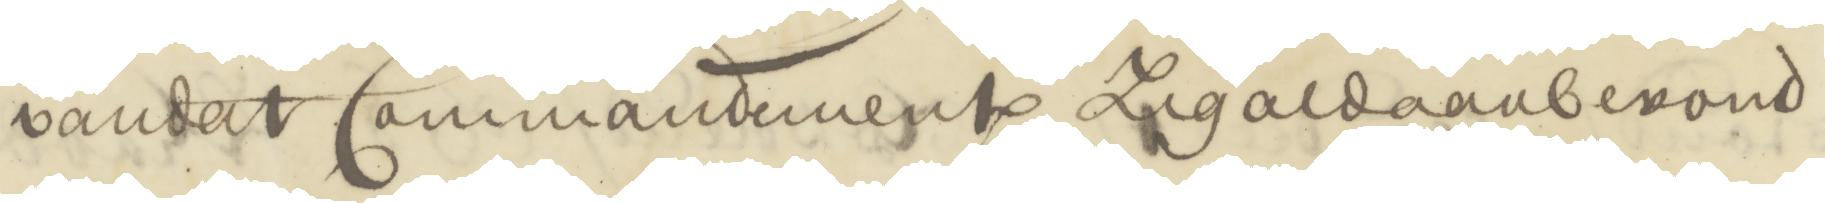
vandat Commandement Zig aldaar bevond
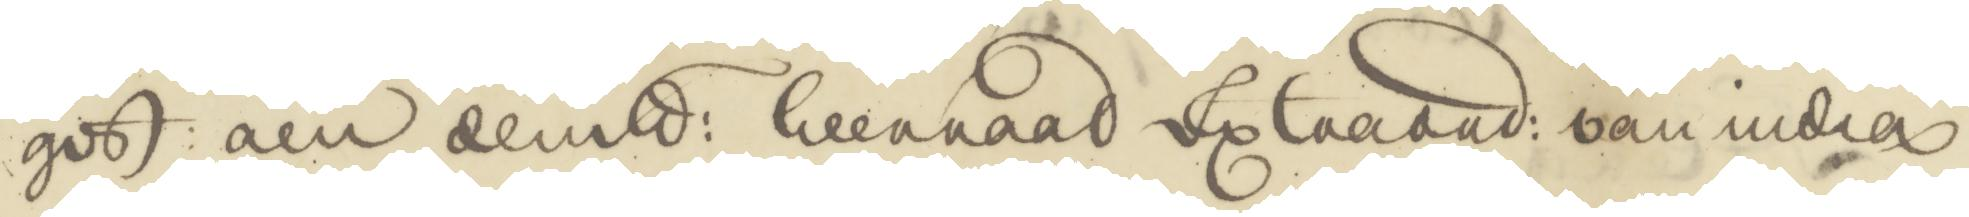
ges: aen den Ed: heer raad Extraord: van india
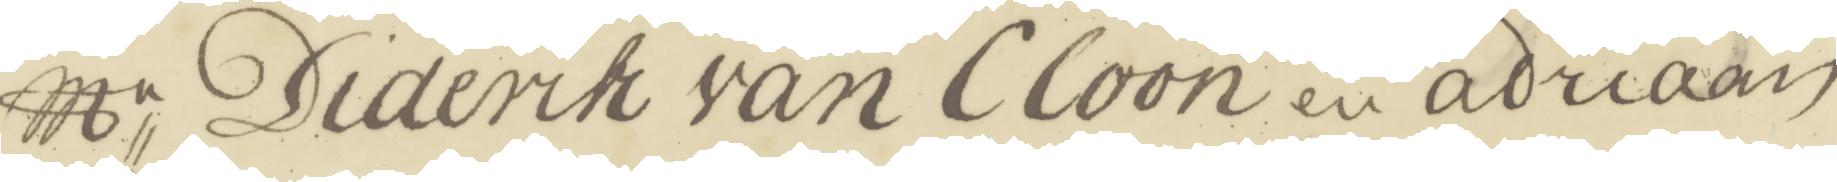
M„r Diderik van Cloon en adriaan
